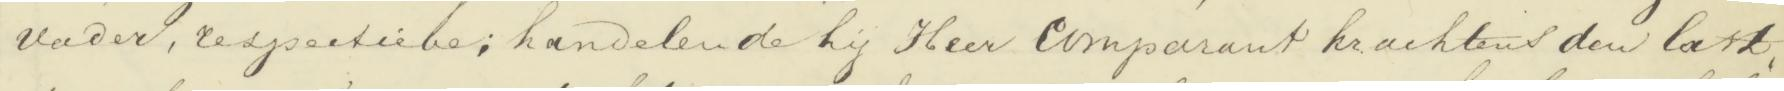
vader, respectieve; handelende hij Heer Comparant krachtens den last,
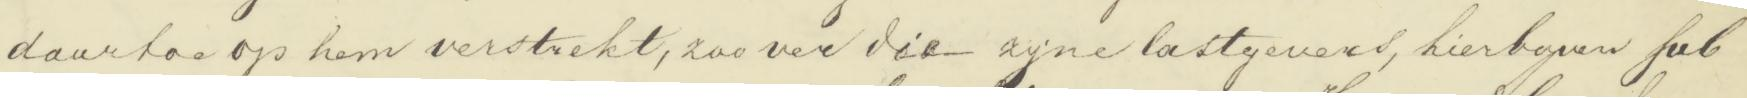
daartoe op hem verstrekt, zoo ver die zijne lastgevers, hierboven sub
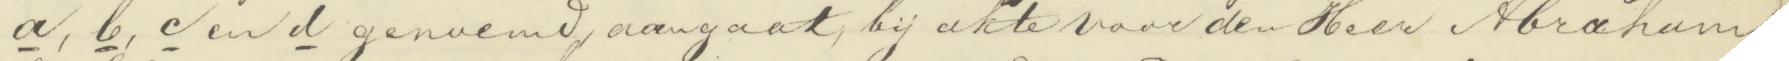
a, b, c en d genoemd, aangaat, bij akte voor den Heer Abraham
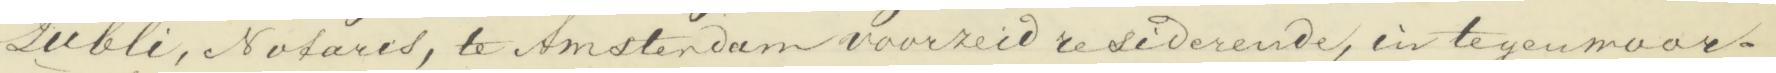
Zubli, Notaris, te Amsterdam voorzeid residerende, in tegenwoor=
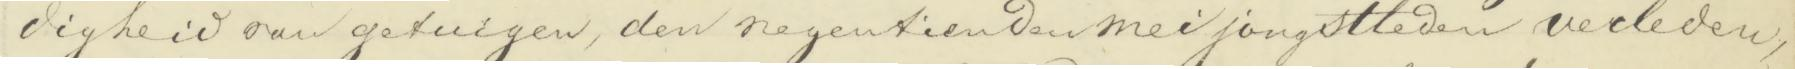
digheid van getuigen, den negentienden mei jongstleden verleden,
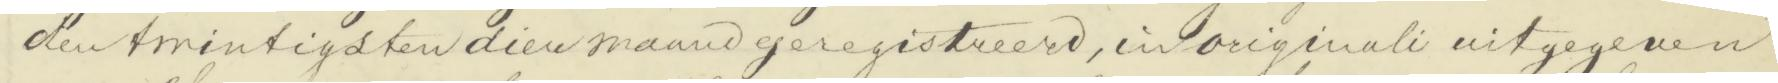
den twintigsten dier maand geregistreerd, in originali uitgegeven
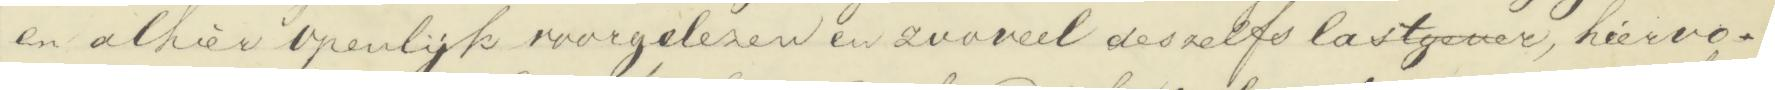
en alhier openlijk voorgelezen en zooveel deszelfs lastgever, hiervo=
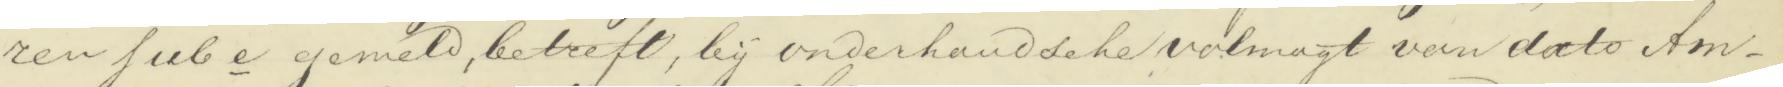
ren sub e gemeld, betreft, bij onderhandsche volmagt van dato Am=
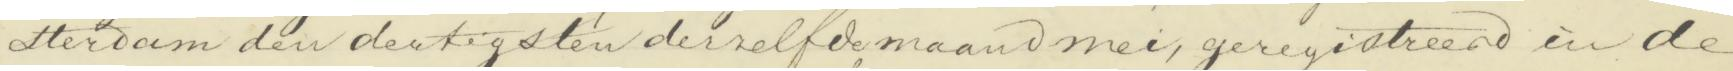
sterdam den dertigsten derzelfde maand mei, geregistreerd in de
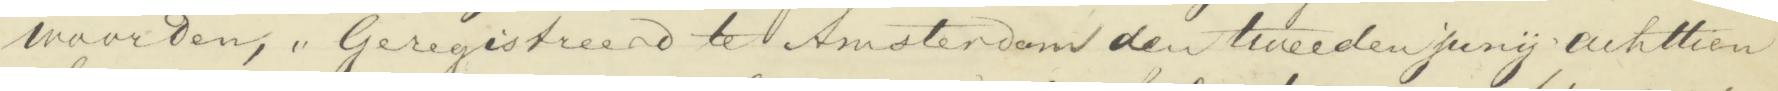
woorden, „ Geregistreerd te Amsterdam den tweeden junij achttien
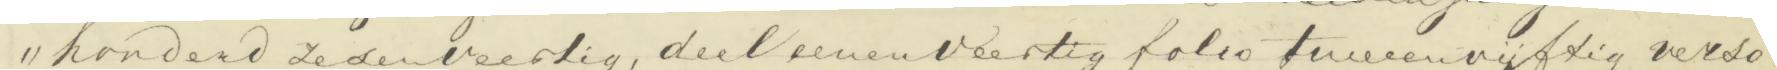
„honderd zes en veertig, deel een en veertig folio twee en vijftig verso
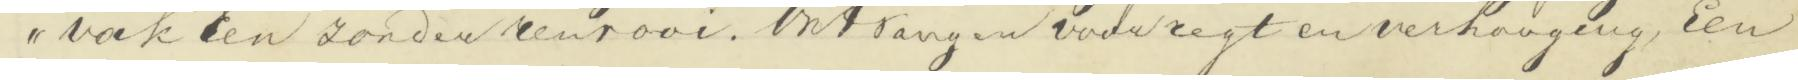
„ vak Een zonder renvooi, Ontvangen voor regt en verhooging, Een
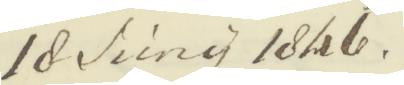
18 Iunij 1846.
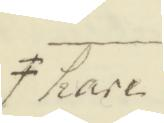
¶ hare
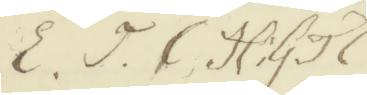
E. T. C: H:GTC
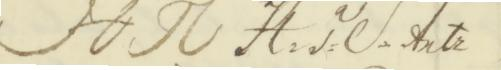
H:T.C. H.TC.Antz
